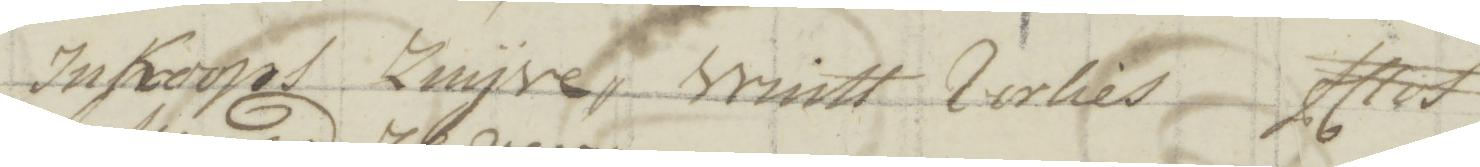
Inkoops Zuijve„ winst Verlies pCtos
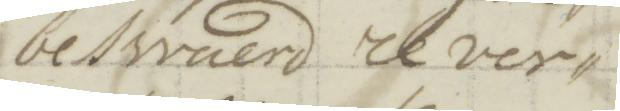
beswaerd re ver„
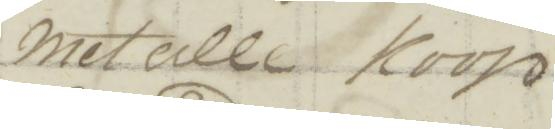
met alle koop
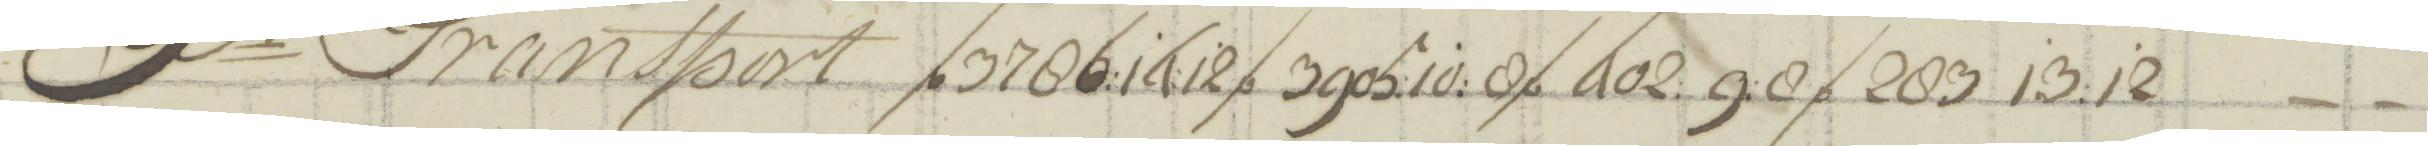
P=r Transport ƒ3786:14:12 ƒ3905:10: 8 ƒ402:9:8 ƒ283 13:12 – –
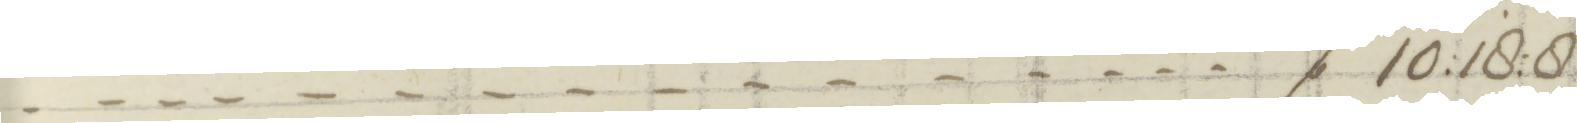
– – – – – – – – – – – – – - - - ƒ 10:18:8
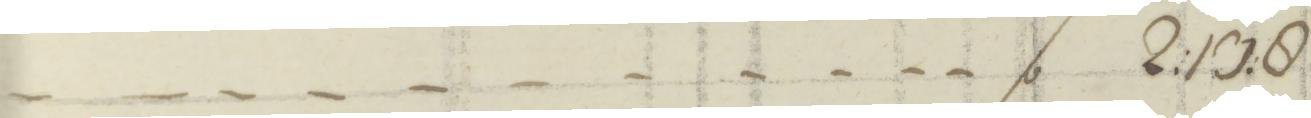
– – – – – – – - - - - ƒ 2:13:8
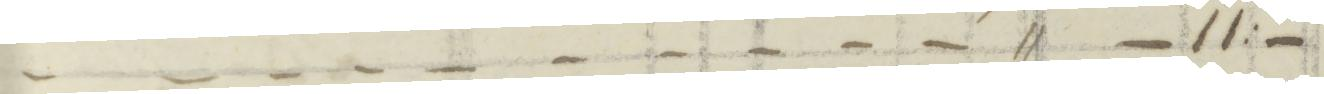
– – – – – – – – – – „ — 11: —
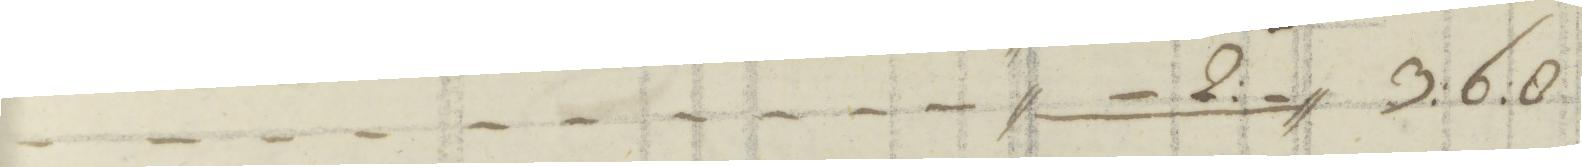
– – – – – – – – – – „ – 2: – „ 3:6:8
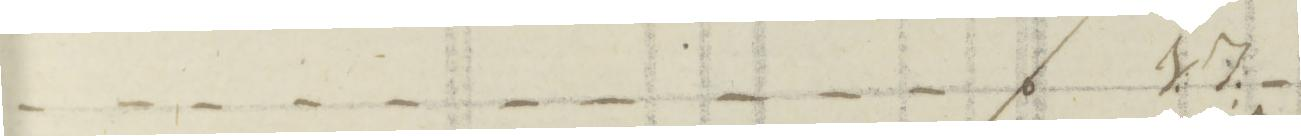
– – – – – – – – – – ƒ 1:7: –
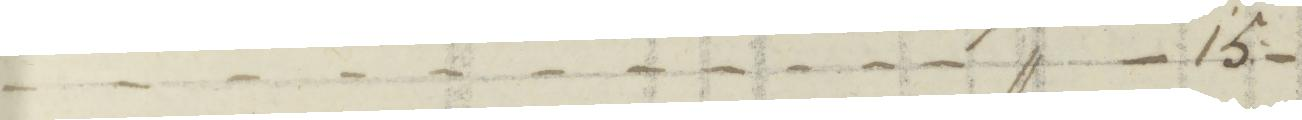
– – – – – – – – – – – „ –15:–
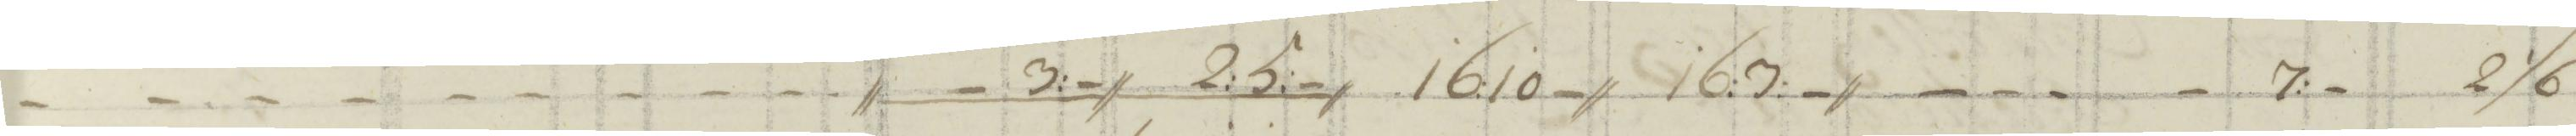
– – – – – – – – – - „ – 3: –„ 2:5:–„ 16:10–„ 16:3:–„ — – - – 7:– 2 1/6
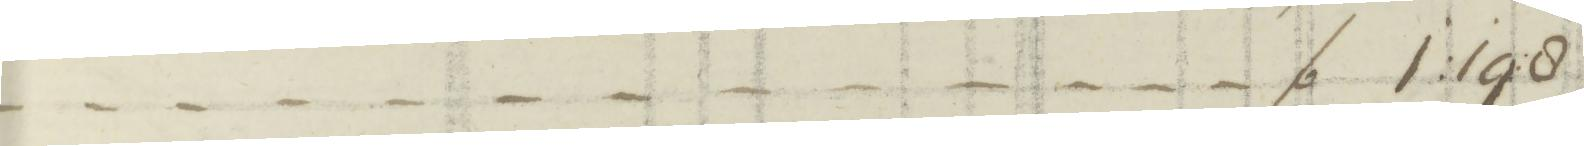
– – – – – – – – – – – – – ƒ 1:19:8
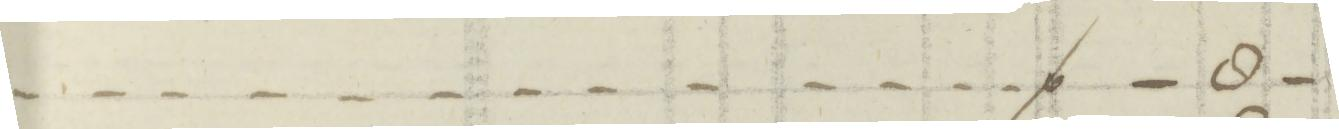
– – – – – – – – – – – - - ƒ – 8 –
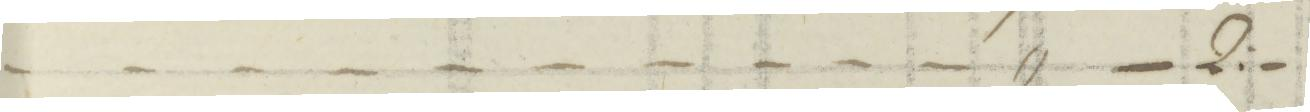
– – – – – – – – – – „ – 2:–
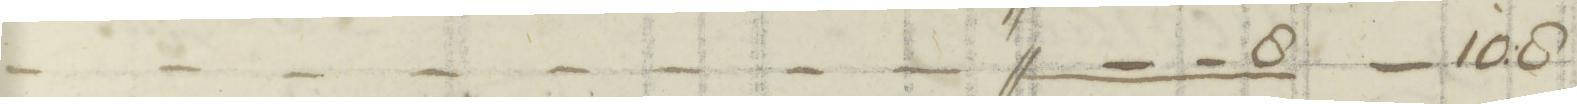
– – – – – – – – „ – – 8 —10:8
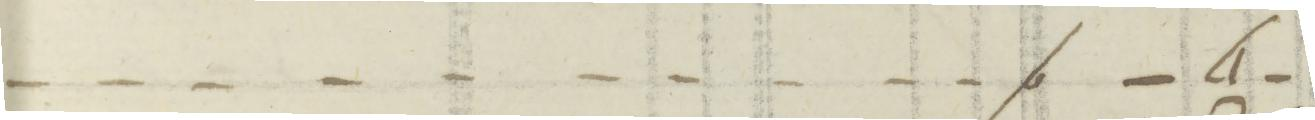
– – – – – – – – – ƒ – 4 –
